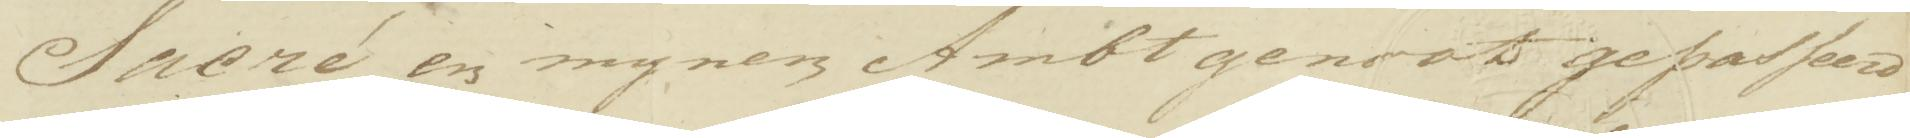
Sacré en mynen Ambtgenoot gepasseerd
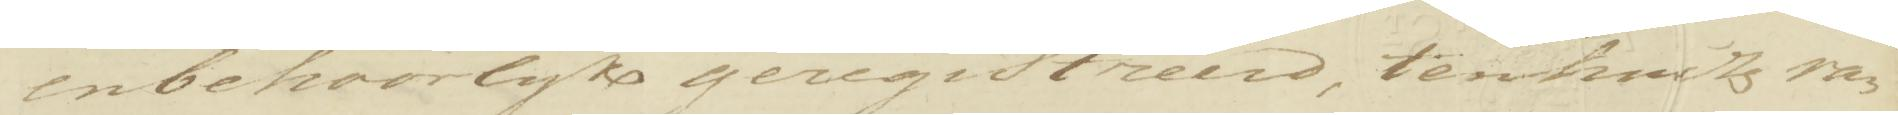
en behoorlyk geregistreerd, ten huize van
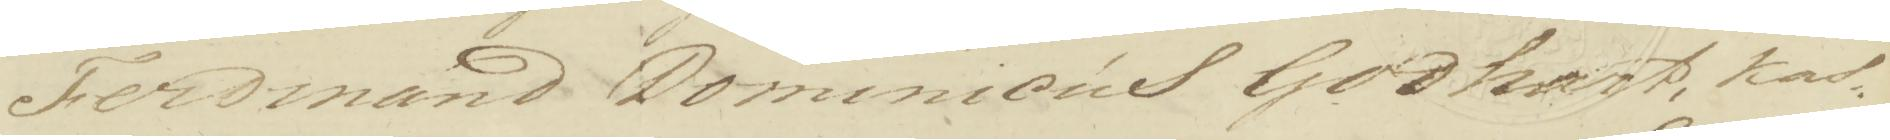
Ferdinand Dominicus Godhart, kas„
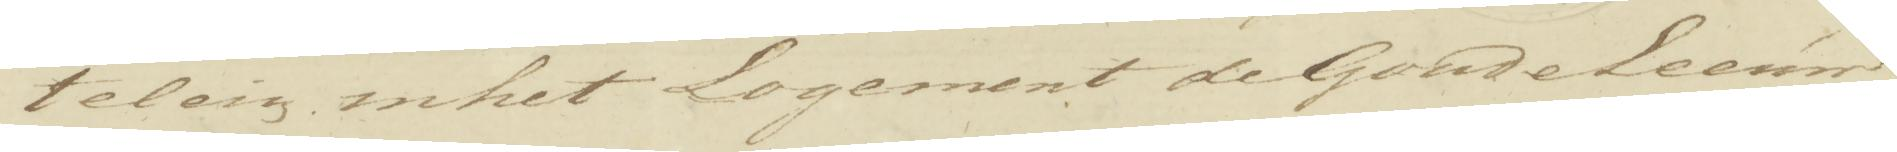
telein in het Logement de Goude Leeuw
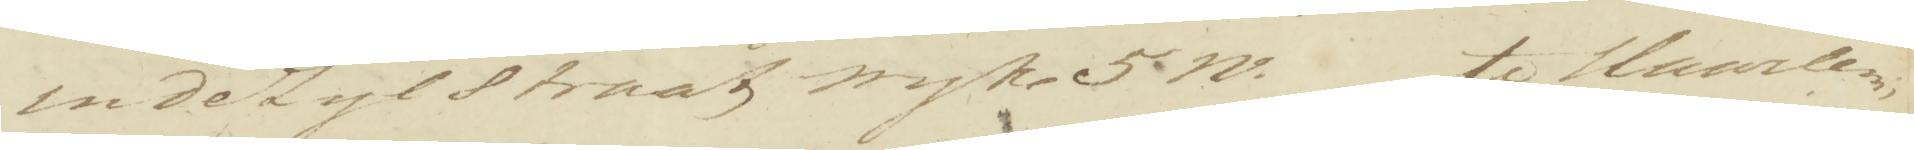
in de Zylstraat wyk 5 n.o te Haarlem,
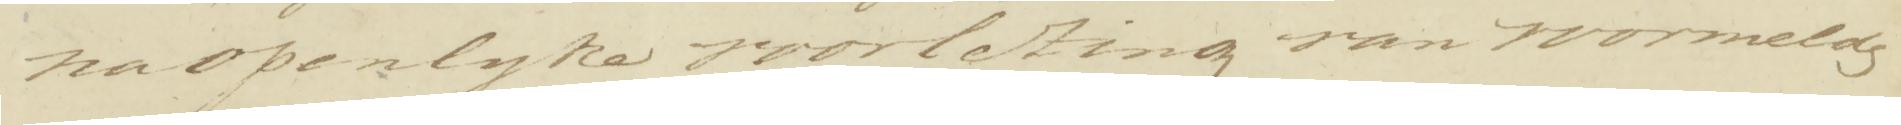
na openlyke voorlezing van voormelde
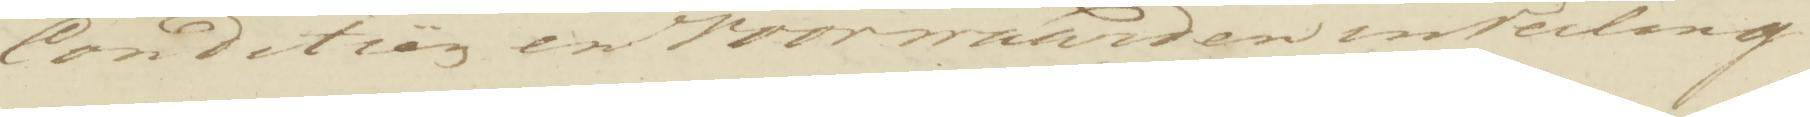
conditien en voorwaarden in veiling
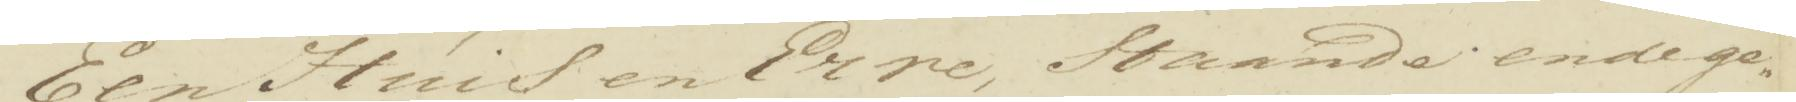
Een Huis en Erve, staande ende ge„
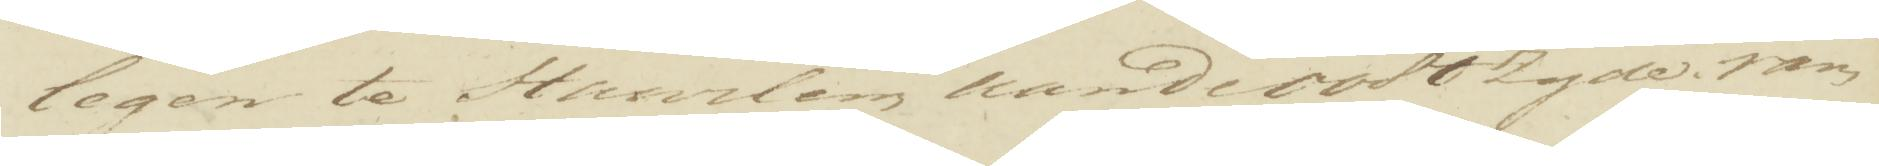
legen te Haarlem aan de oostzyde van
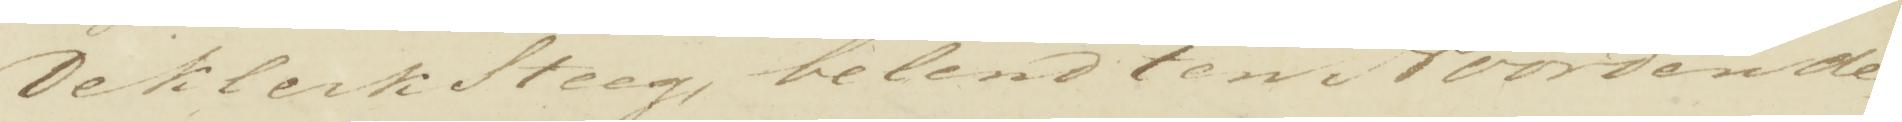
de klerksteeg, belend ten Noorden de
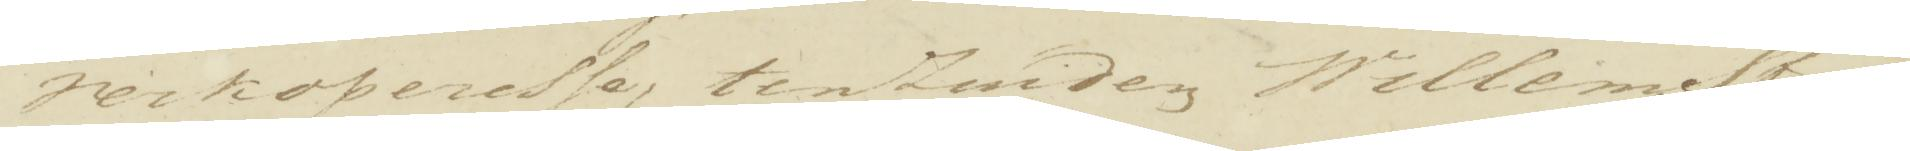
verkoperesse, ten zuiden Willem Stren
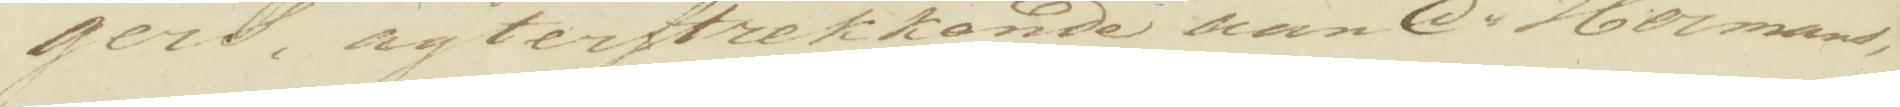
gers, agterstrekkende aan C: Hermans,
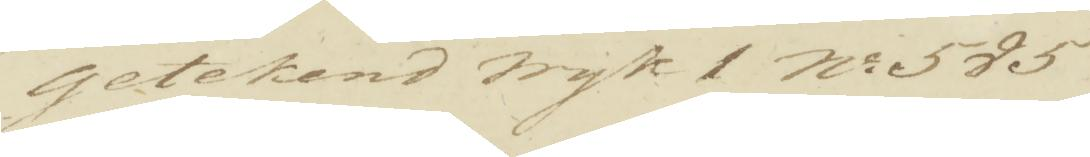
getekend wyk 1 n=o 585
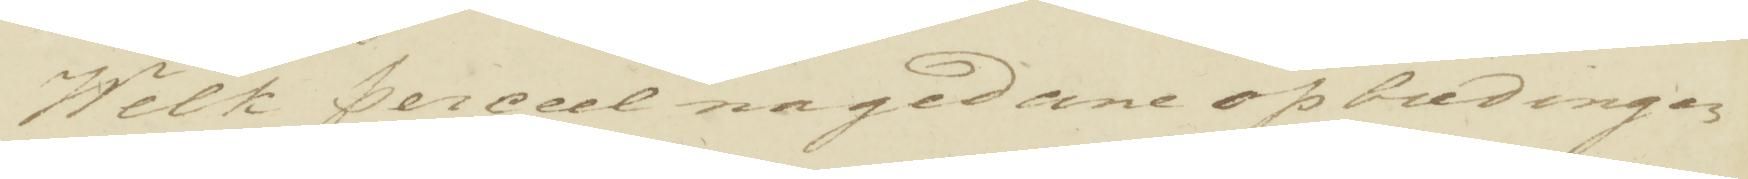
Welk perceel na gedane opbiedingen
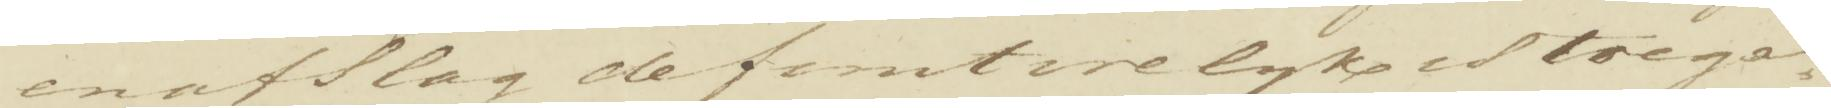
en afslag definitivelyk is toege=
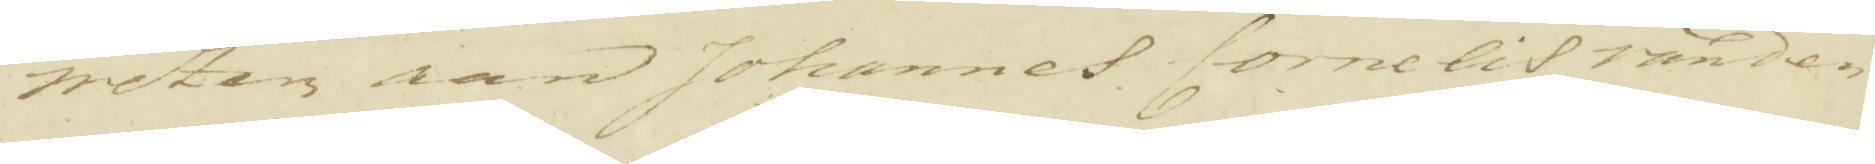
wezen aan Johannes Cornelis van den
